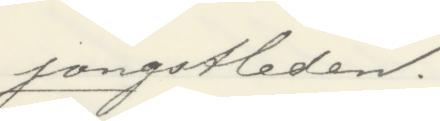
jongstleden.
